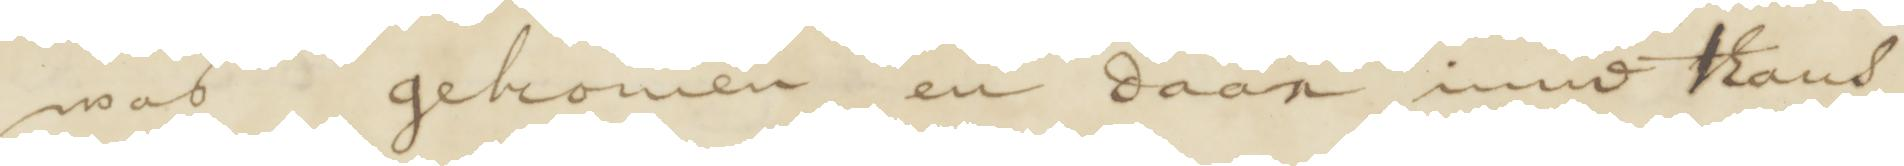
was gekomen en daar inne thans
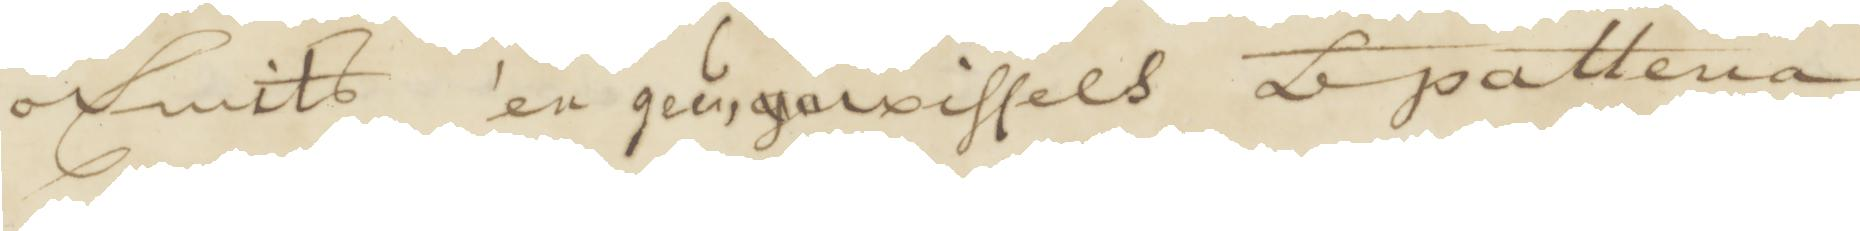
overmits er geen gewissels te pattena
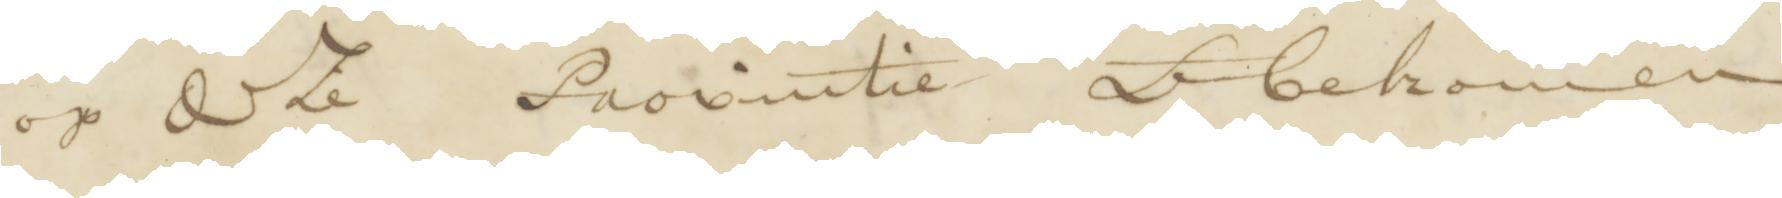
op deze Provintie te bekomen
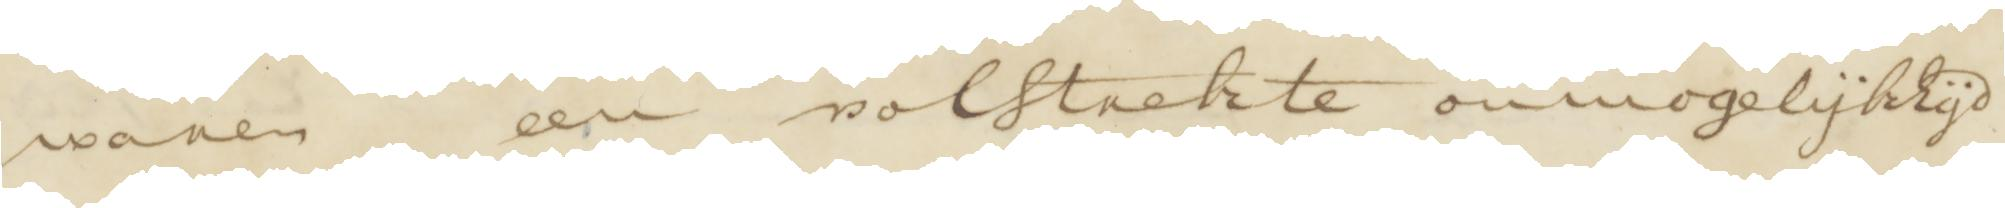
waren een volstrekte onmogelijkhijd
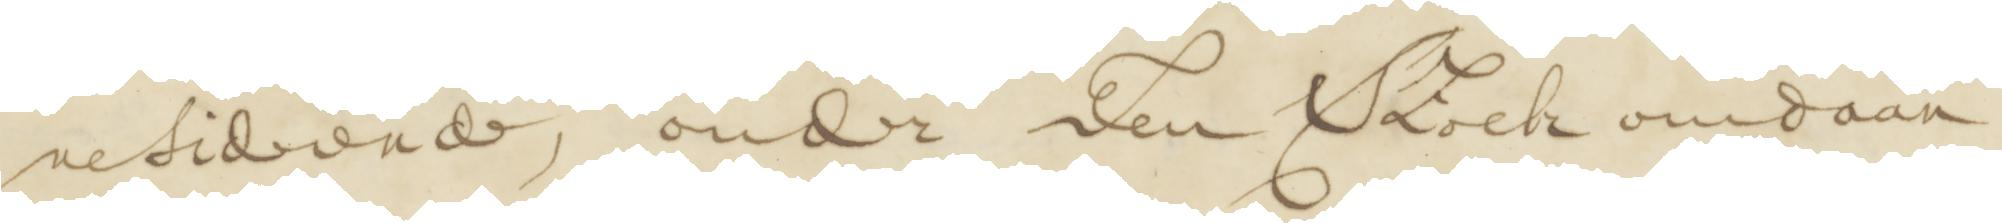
resideerde, onder Een verzoek om daar
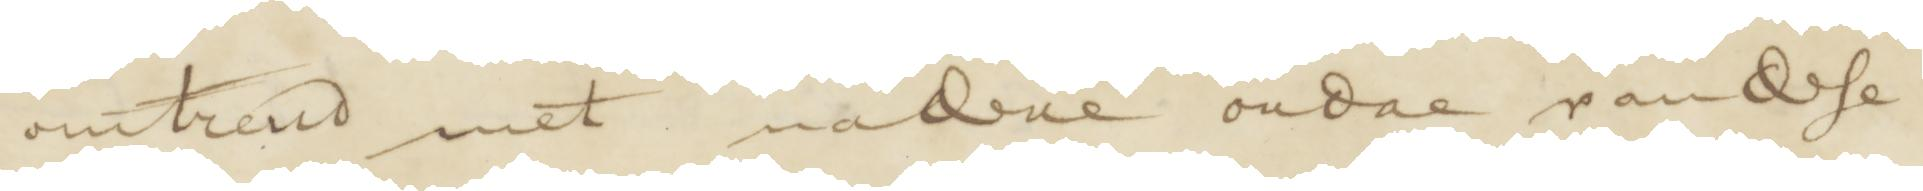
omtrend met nadere ordre van dese
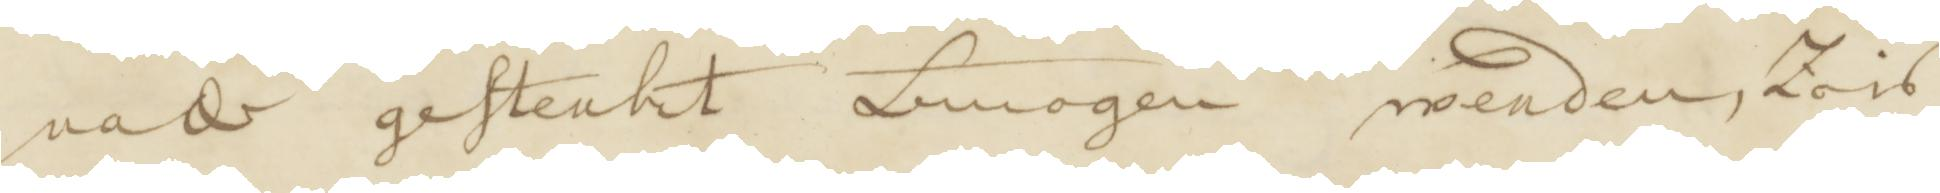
nader gesterkt temogen werden, Zo is
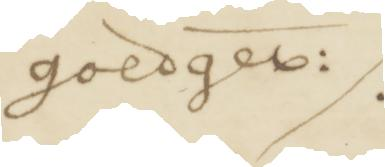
goedgev:/
